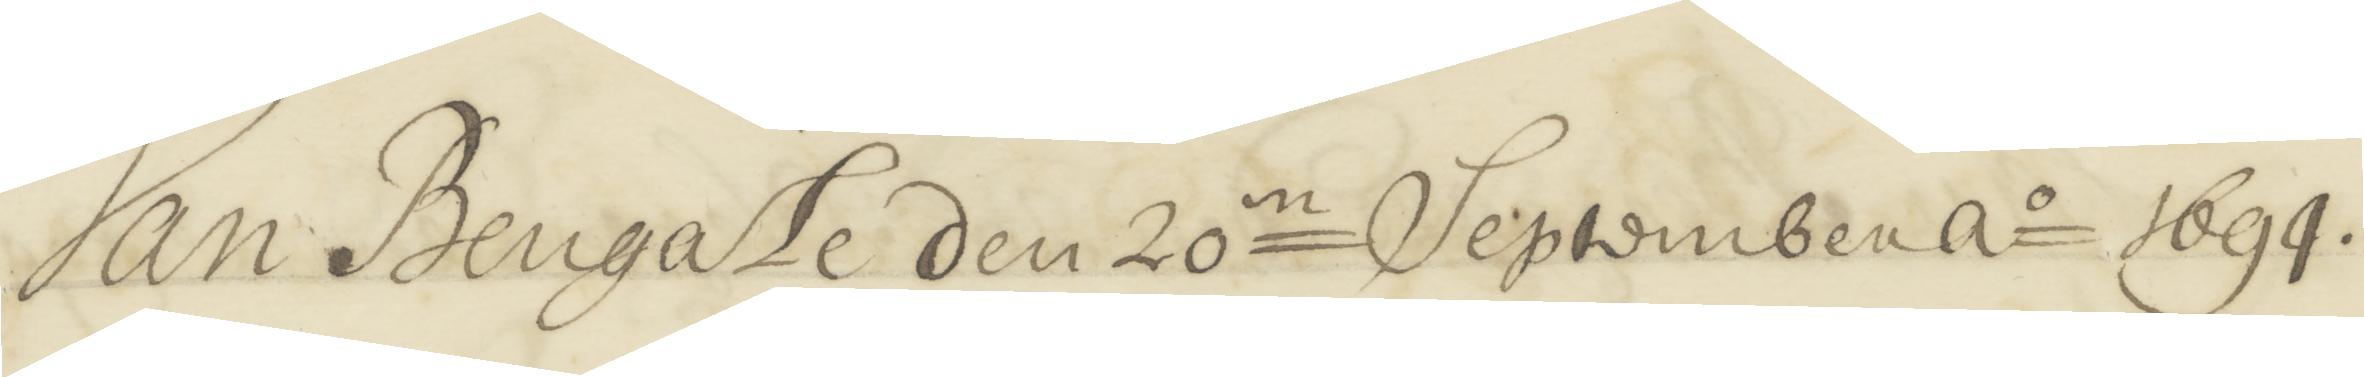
Van Bengale den 20=n September a=o 1694.
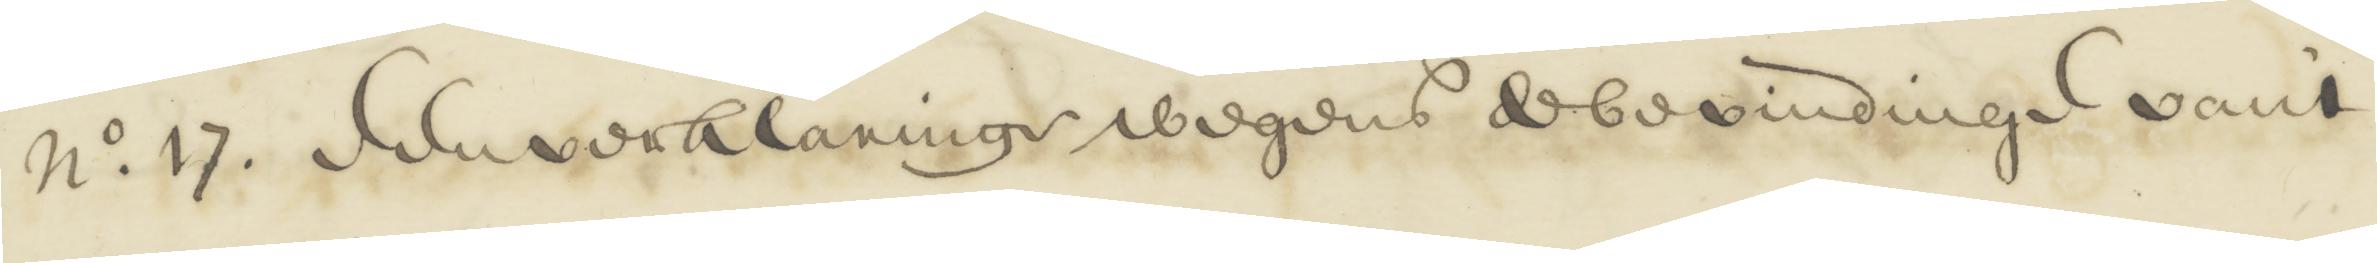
N.o 17. Een verklaringe wegens de bevindinge van’t
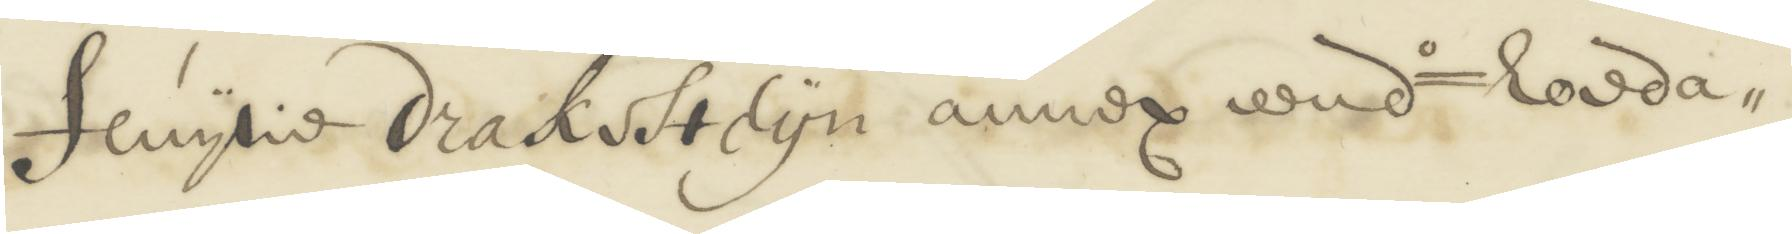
fluijtie drakesteijn annex een d=o hoeda„
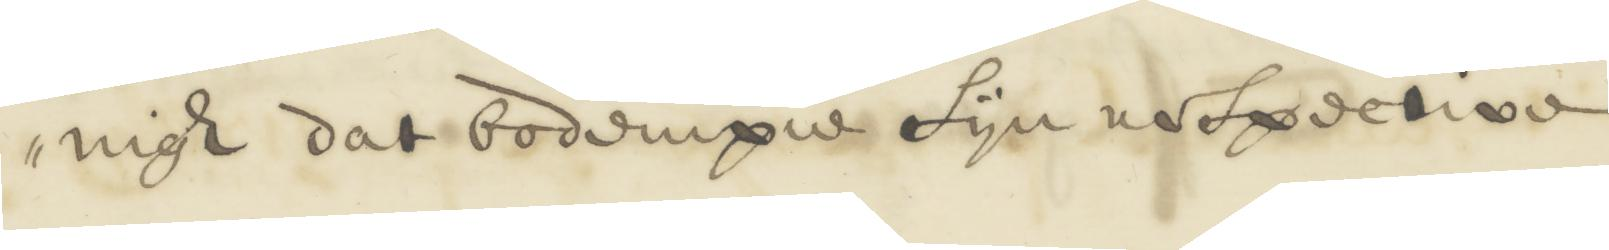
„nigh dat bodempie sijn respective
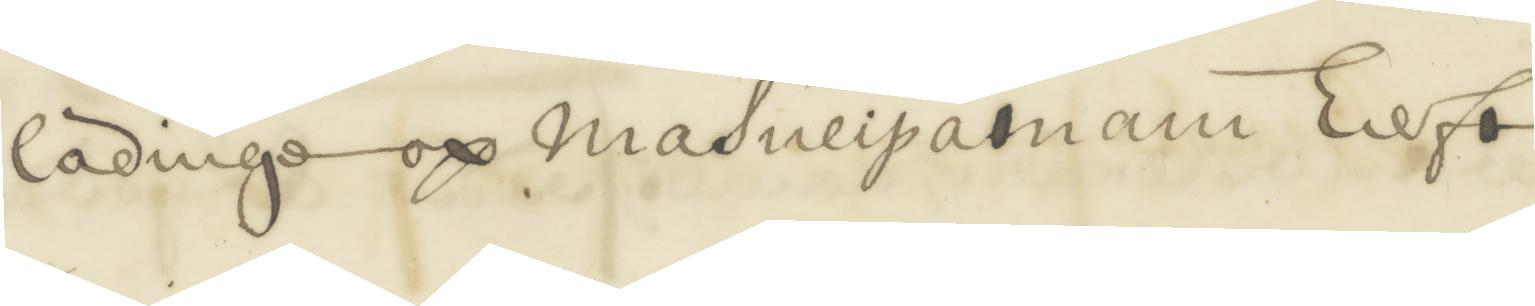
ladinge op masulipatnam heft
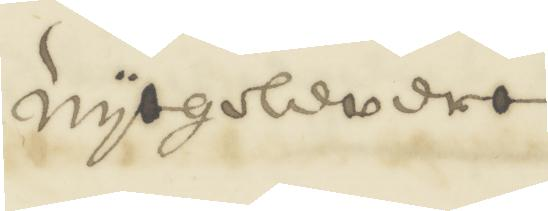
uijtgelevert.
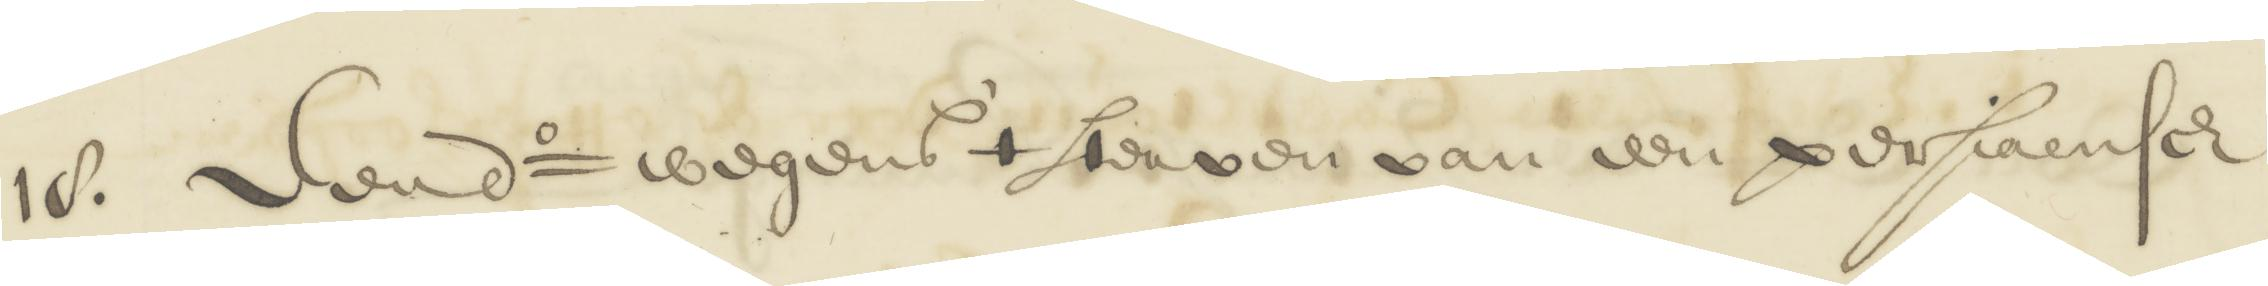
18. Een d=o wegens 't sterven van een persiaensch
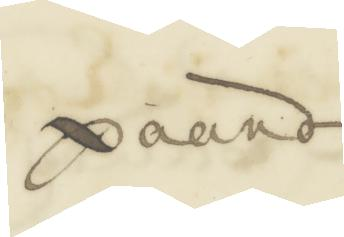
paard.
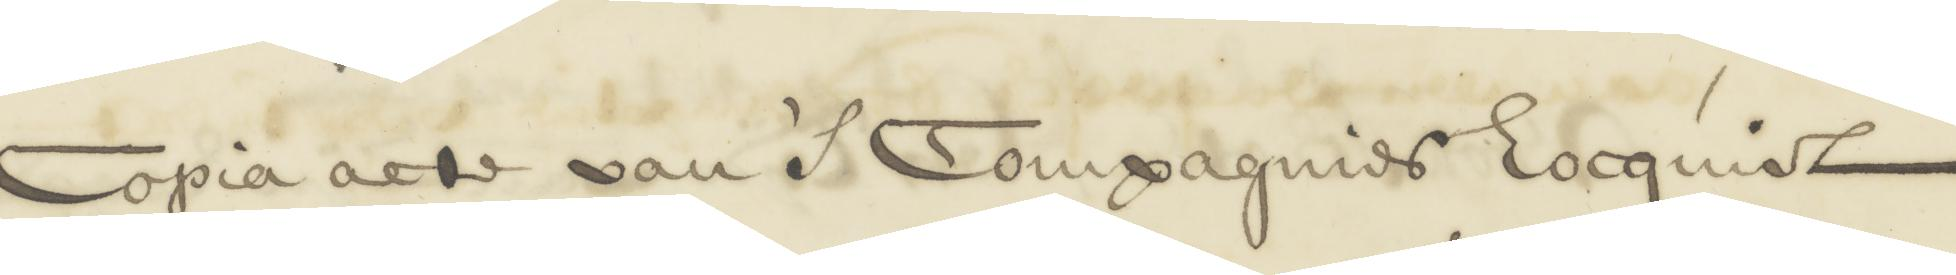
Copia acte van ’s Compagnies hocquiel
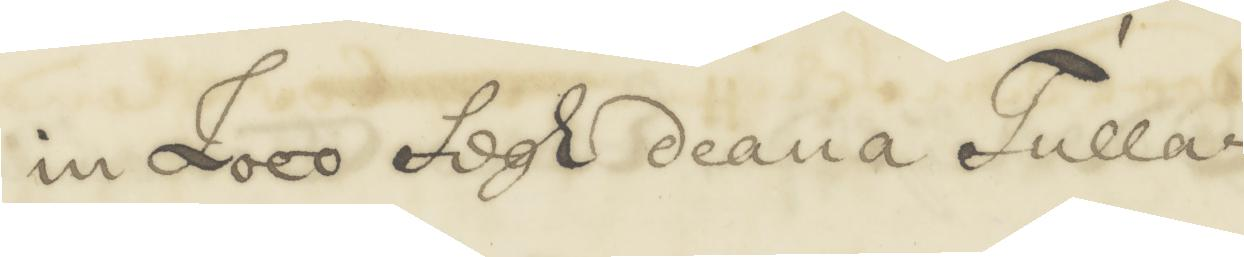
in Loco segh deana Tulla
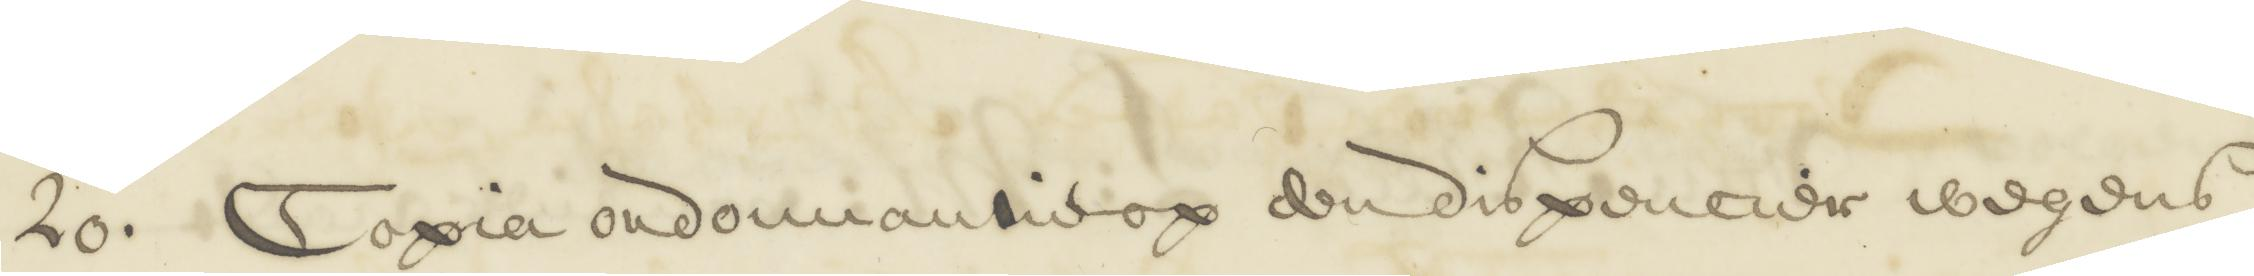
20. Copia ordonnantie op den dispencier wegens
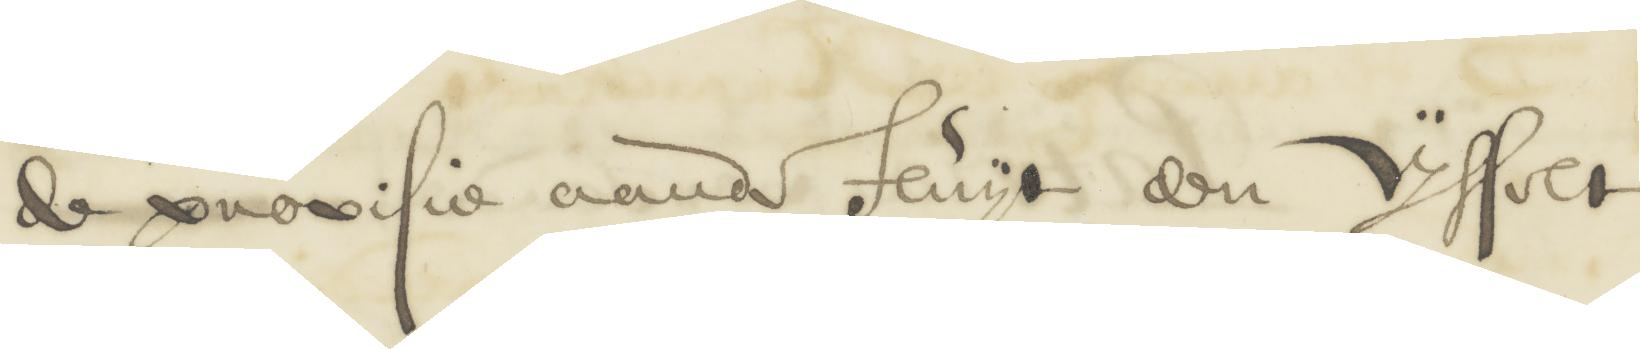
de provisie aande fluijt den IJsselt
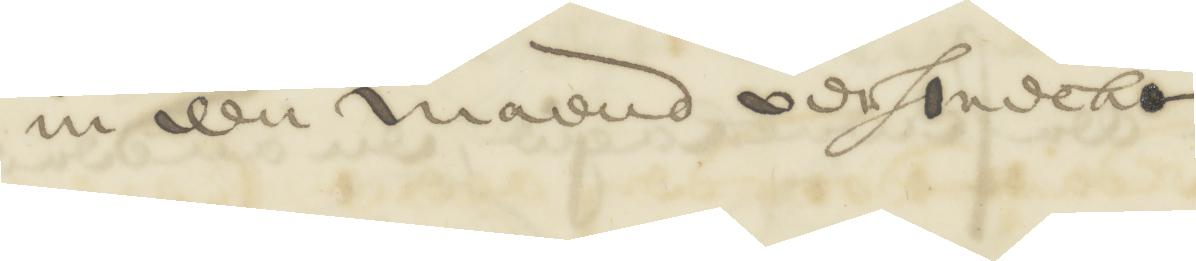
in een maend verstreckt
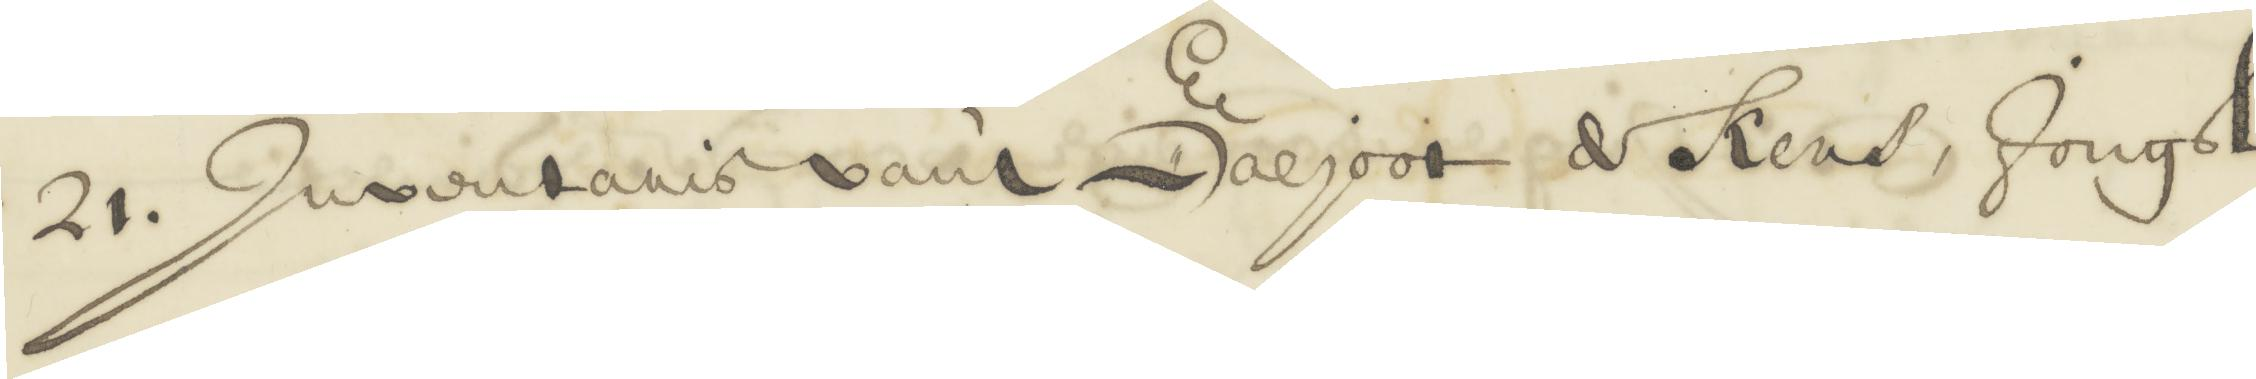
21. Jnventaris van't Galjoot de kers, Jongsl
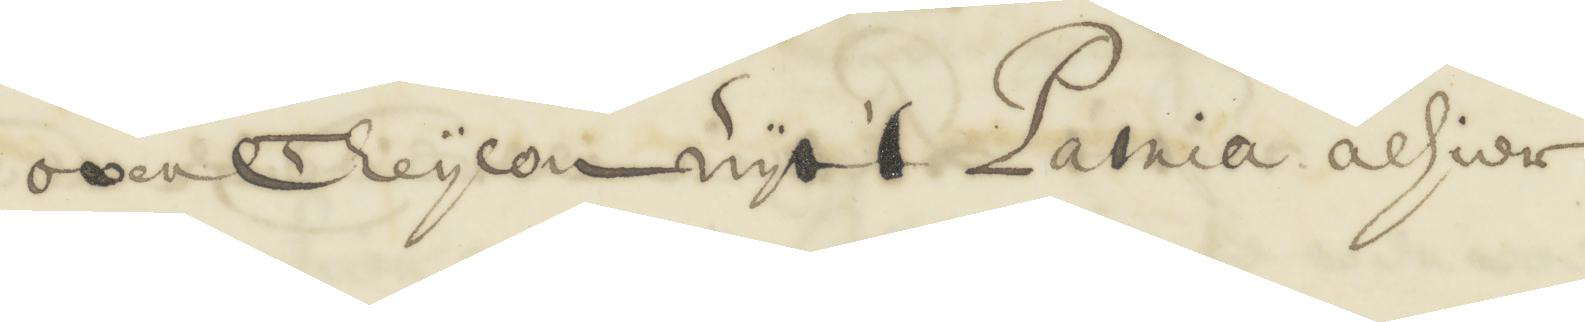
over Cheijlon uijt ’t Patria alhier
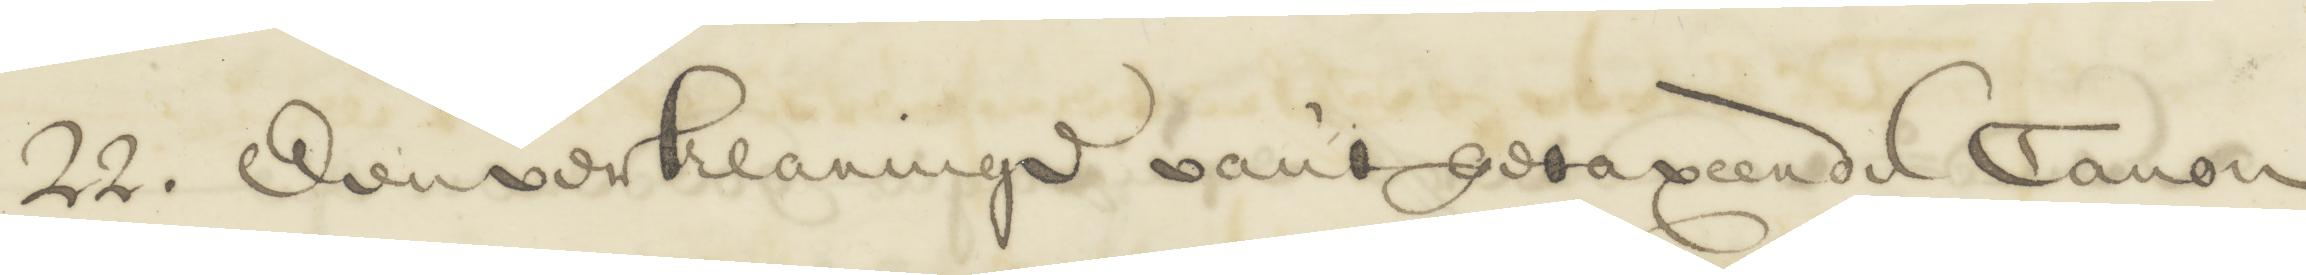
22. Een verklaringe van ’t getaxeerde Canon
